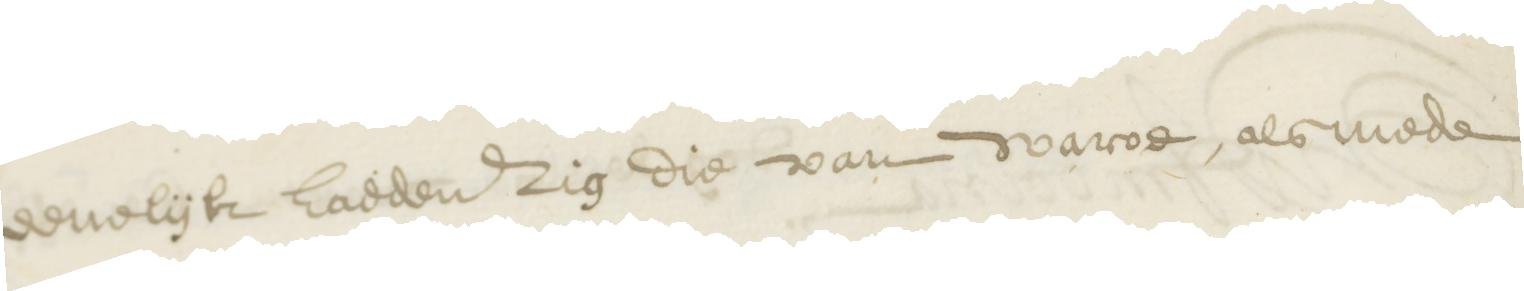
eenelijk hadden zig die van waroe, alsmede
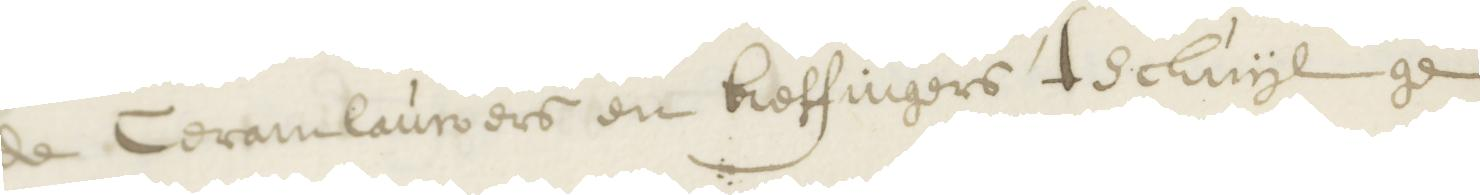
de Ceramlauners en keffingers 't schuijl ge
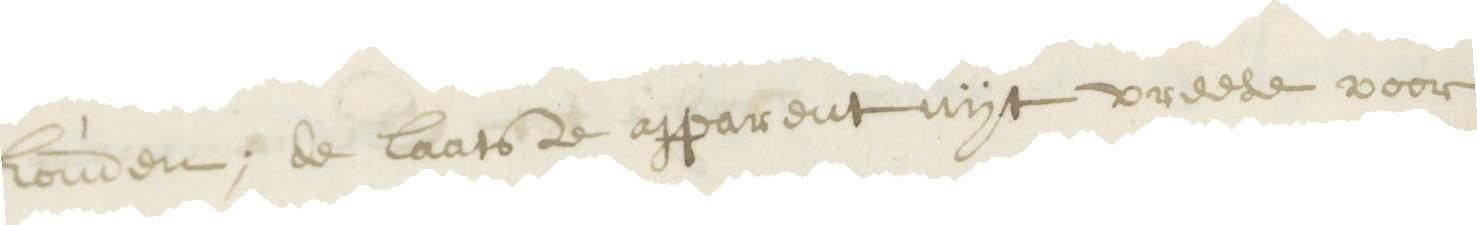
houden; de laatste apparent uijt vreese voor
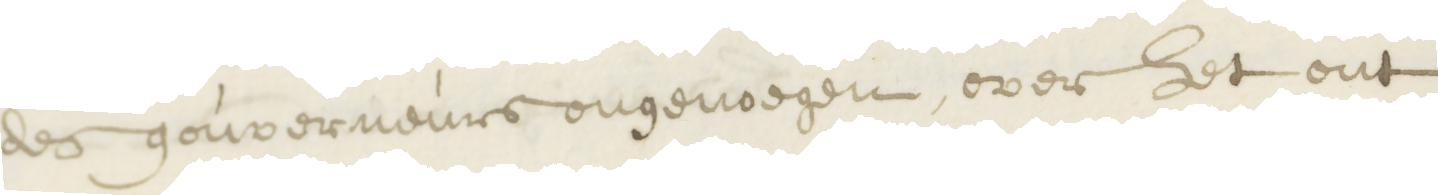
des gouverneurs ongenoegen, over het ont
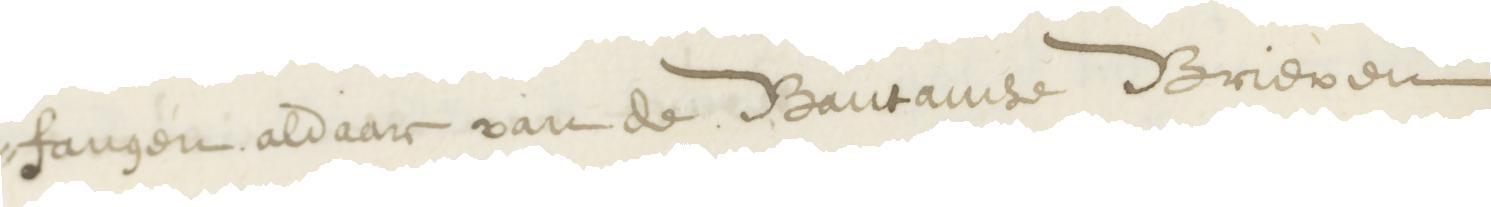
„fangen aldaar van de Bantamse Brieven
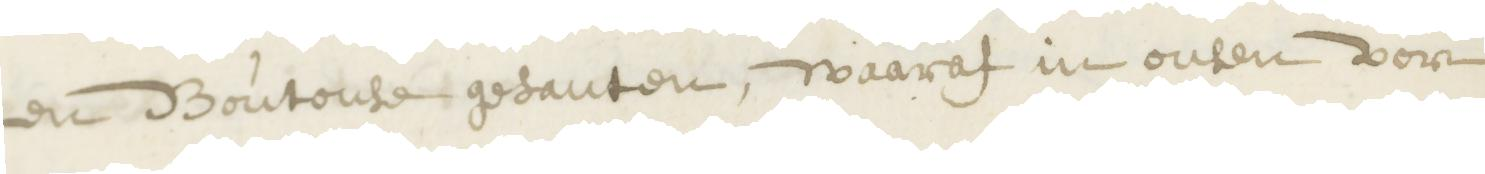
en Boutonse gesanten, waaraf in onsen vori
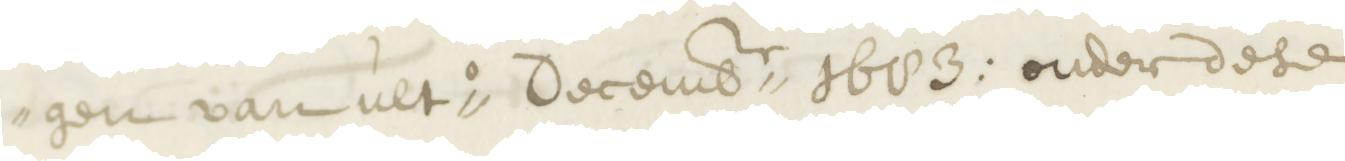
„gen van ult„o Decemb„r 1683: onder dese
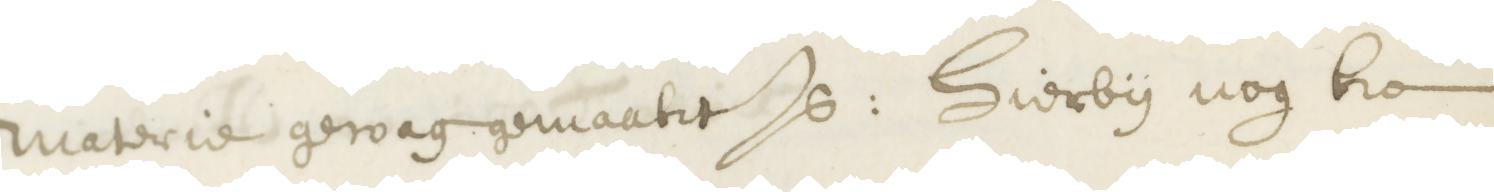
materie gewag gemaakt Is: hierbij nog ko
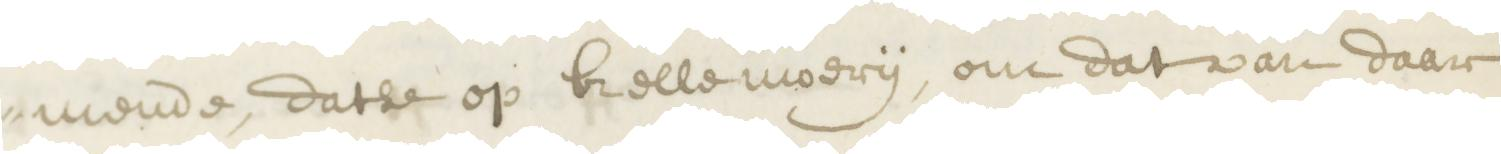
„mende, datse op kellemoerij, om dat van daar
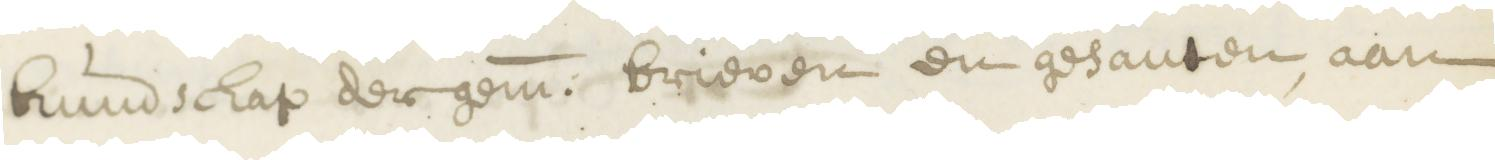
kundschap der gem: brieven en gesanten, aan
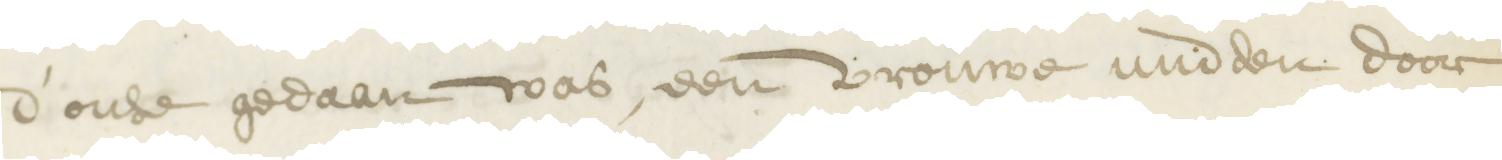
d’ onse gedaan was, een vrouwe midden door
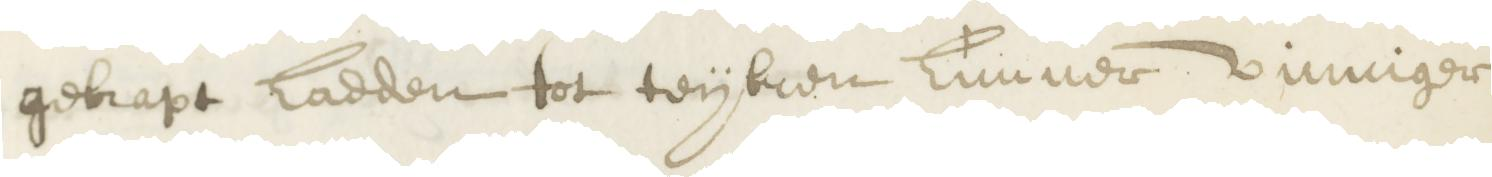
gekapt hadden tot teijken hunner vinniger
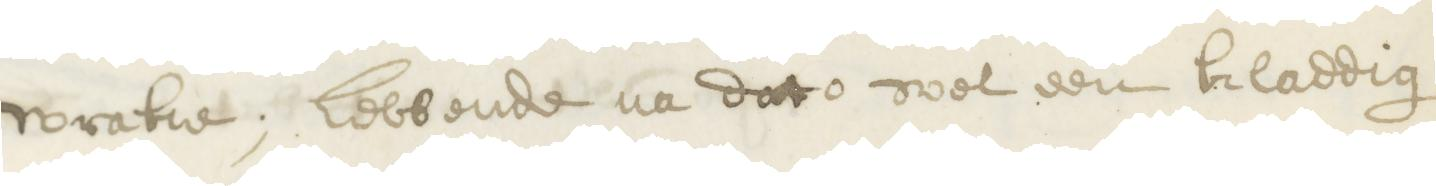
wrake; hebbende na dato wel een kladdig
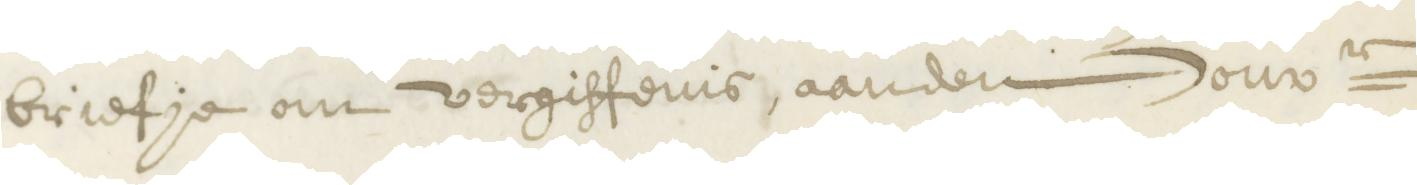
briefje om vergiffenis, aan den Gouv=r
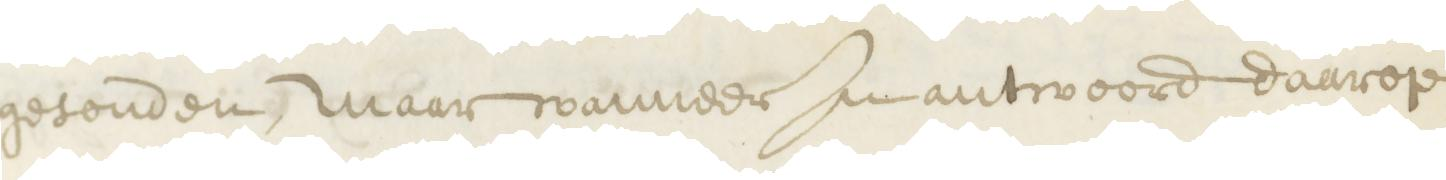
gesonden, maar wanneer In antwoord daarop
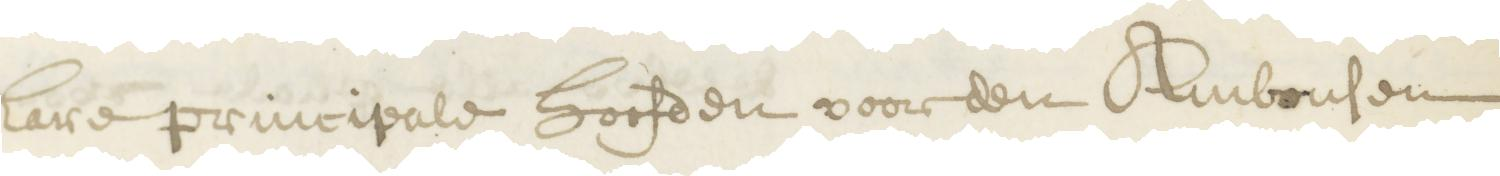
hare principale hoofden voor den Ambonsen
